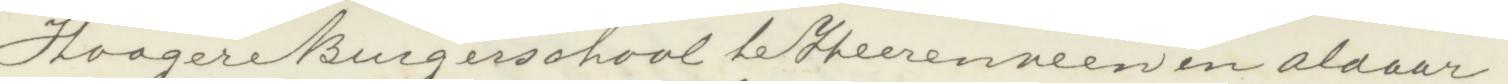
Hoogere Burgerschool te Heerenveen en aldaar
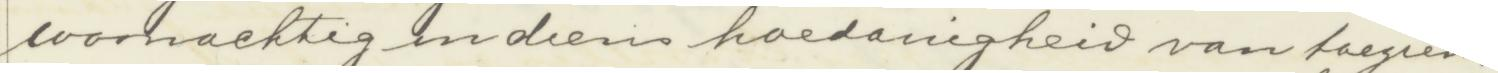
woonachtig in diens hoedanigheid van toezien,
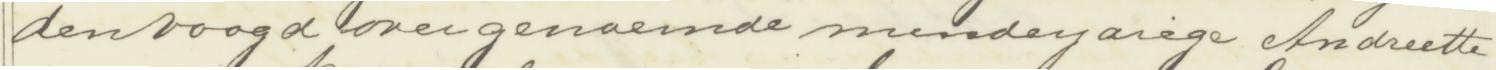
den voogd over genoemde minderjarige Andreette
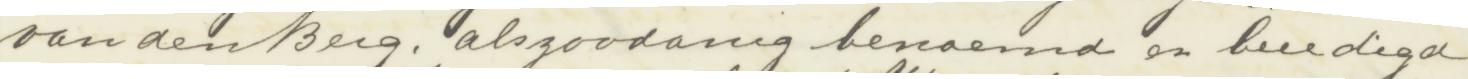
van den Berg, als zoodanig benoemd en beeedigd
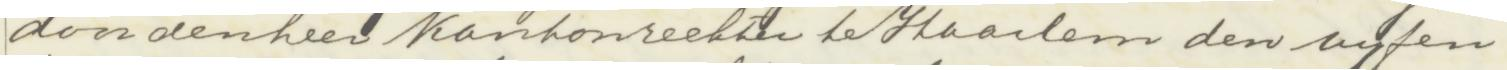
door den heer Kantonrechter te Haarlem den vyfen
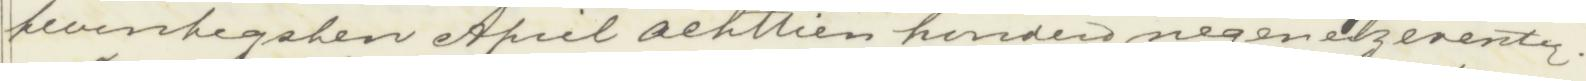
twintigsten April achttien honderd negen enzeventig.
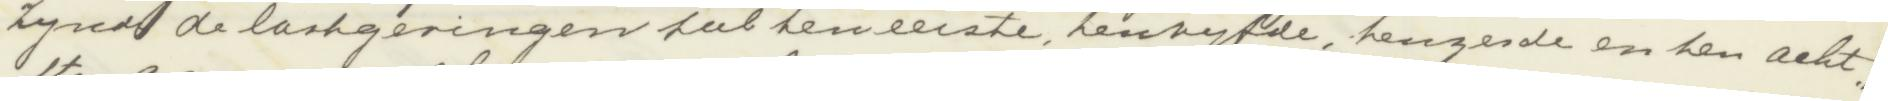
zynde de lastgevingen sub ten eerste, tenvyfde, tenzesde en ten acht„
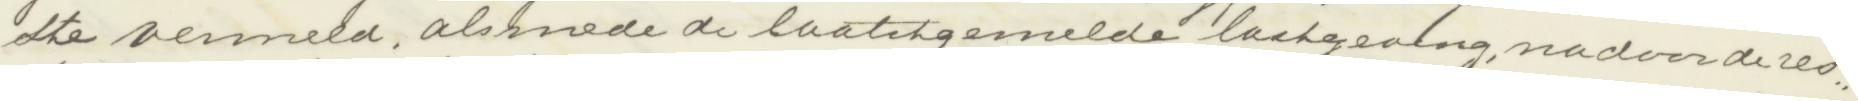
ste vermeld, als mede de laatstgemelde lastgeving, na door de res„
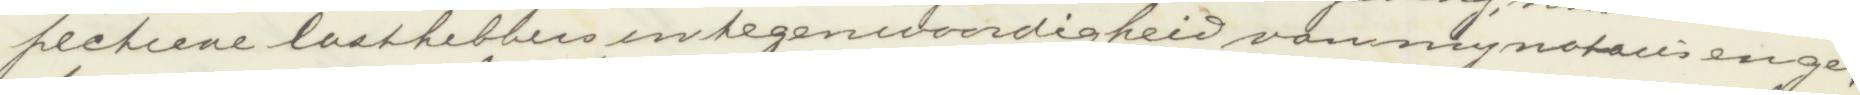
pectieve lasthebbers in tegenwoordigheid van my notaris en ge,
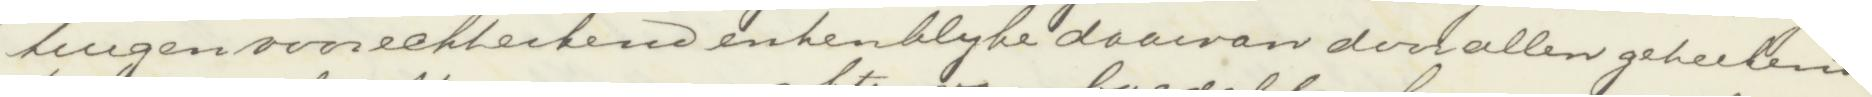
tuigen voor echt erkend en tenblyke daarvan door allen geteekend
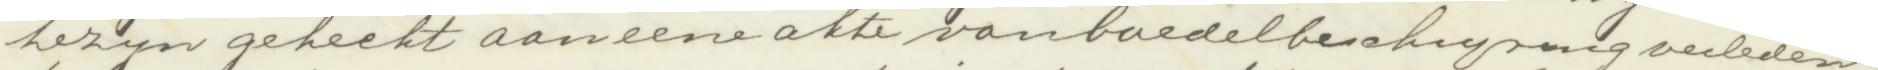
tezyn gehecht aan eene akte van boedelbeschryving verleden
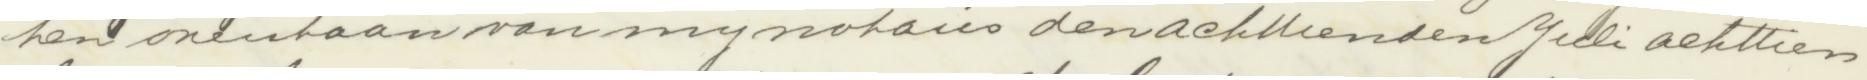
ten overstaan van my notaris den achttienden Juli achttien
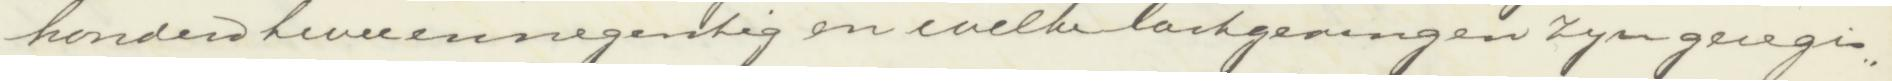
honderd twee ennegentig en welke lastgevingen zyn geregi„
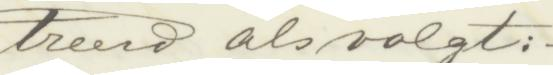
treerd als volgt:
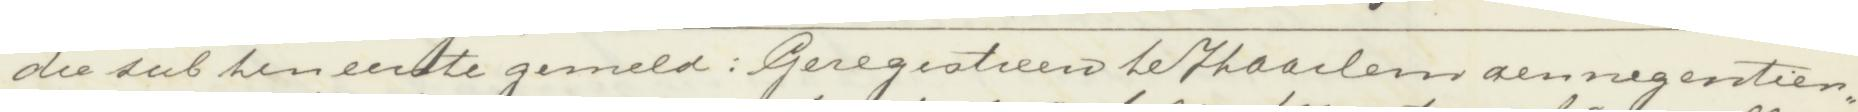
die sub ten eerste gemeld: Geregistreerd te Haarlem den negentien„
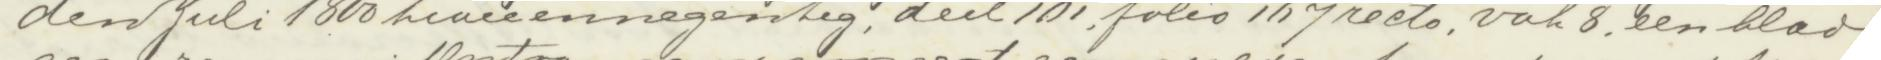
den Juli 1800 twee ennegentig, deel 101, folio 167 recto, vak 8, een blad
